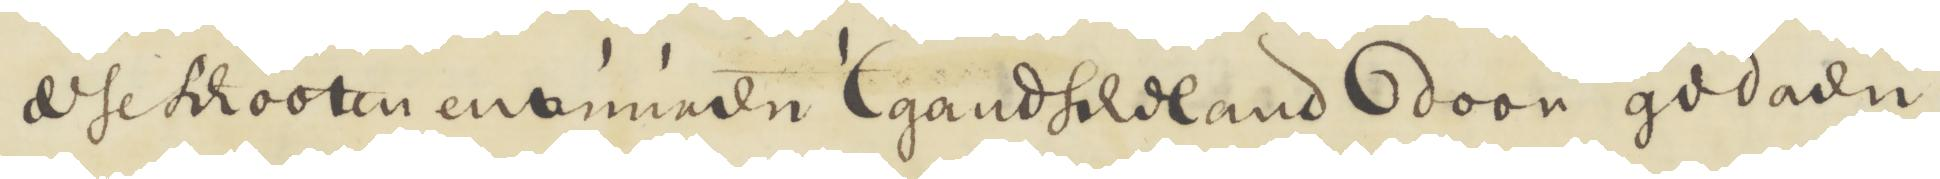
dese schooten en vuuren 't gandscheland door gedaen
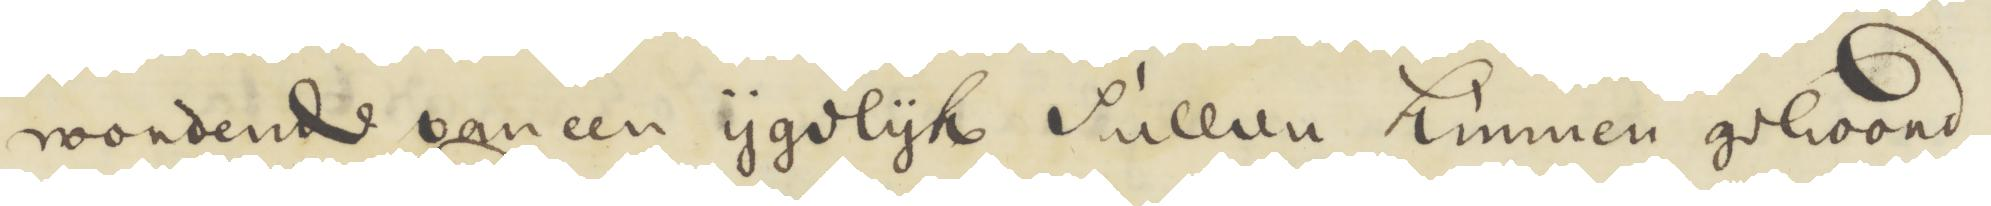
wordende van een ijgelijk sullen kunnen gehoord
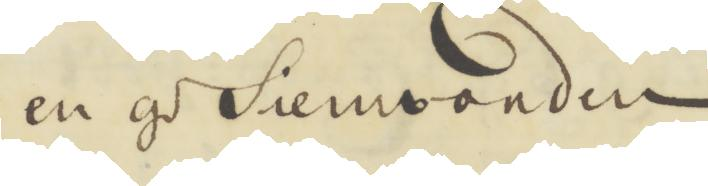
en gesien worden
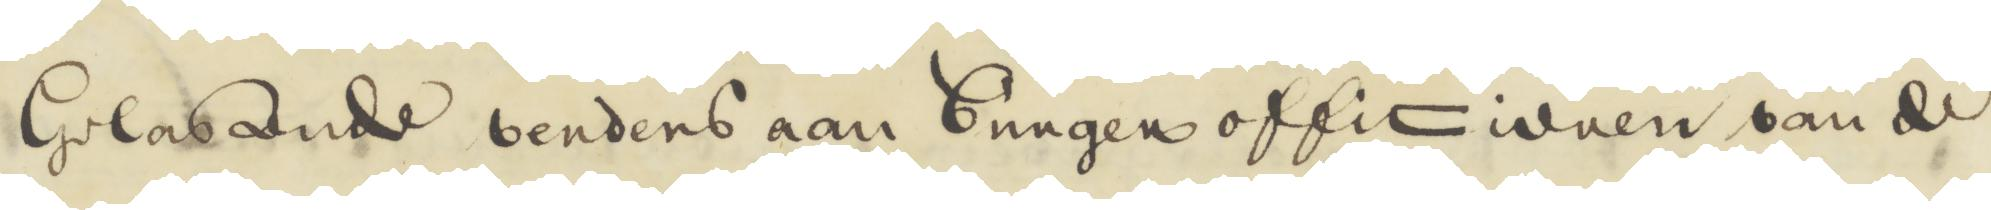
Gelastende verders aan burger officieren van de
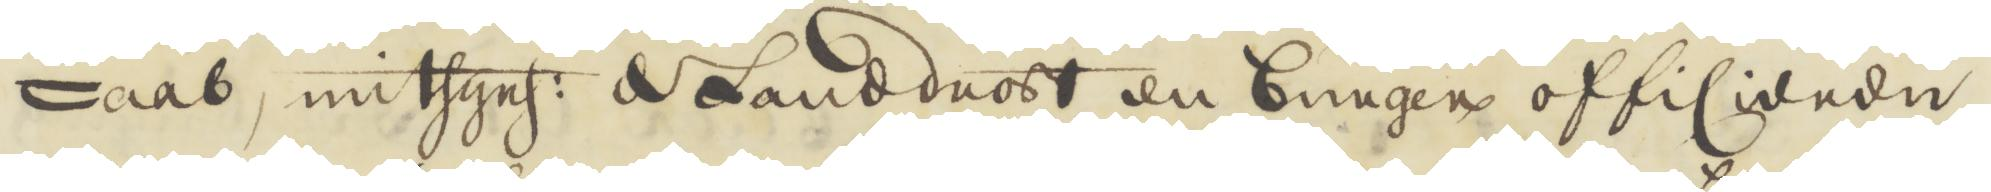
caab, mitsgrs: de Landdrost en burger officieren
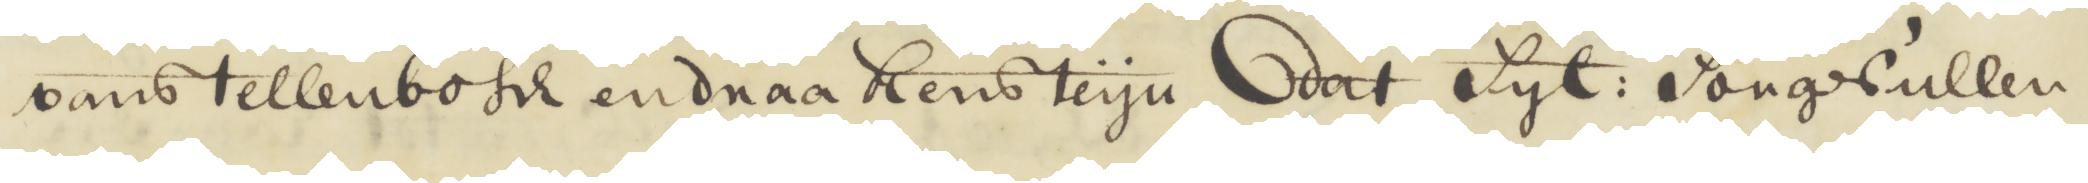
van stellenbosch en draakensteijn dat syl: sorgesullen
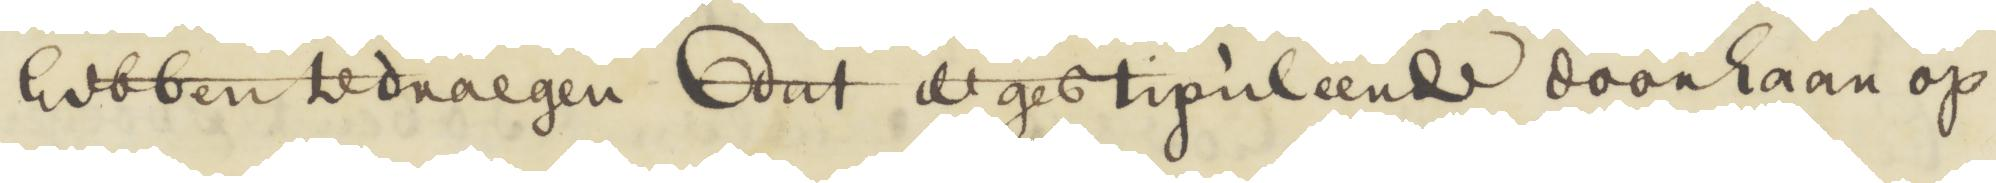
hebben te draegen dat de gestipuleerde door haar op
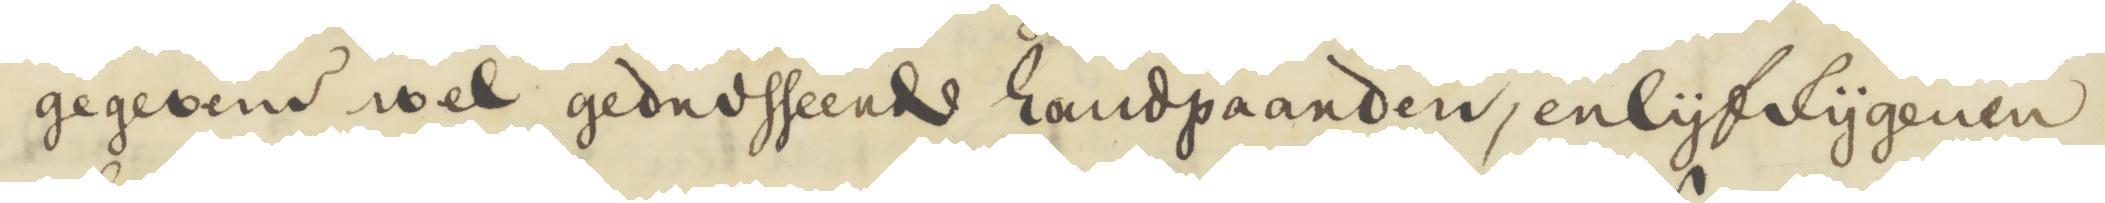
gegevene wel gedresseerde handpaarden, en lijf Eijgenen
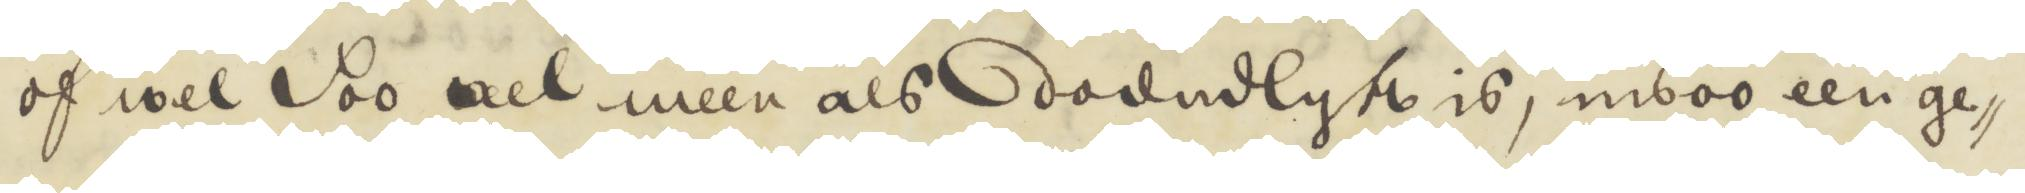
of wel soo veel meer als doenelyk is, insoo een ge„
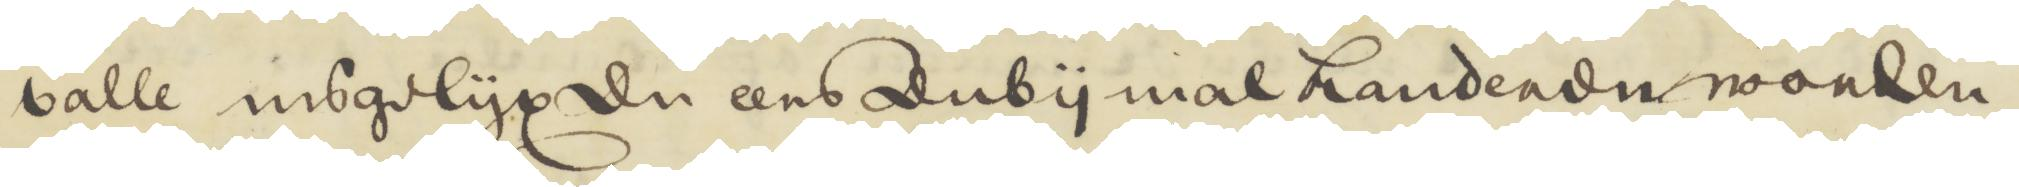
valle insgelijx en eersten bij malkanderen worden
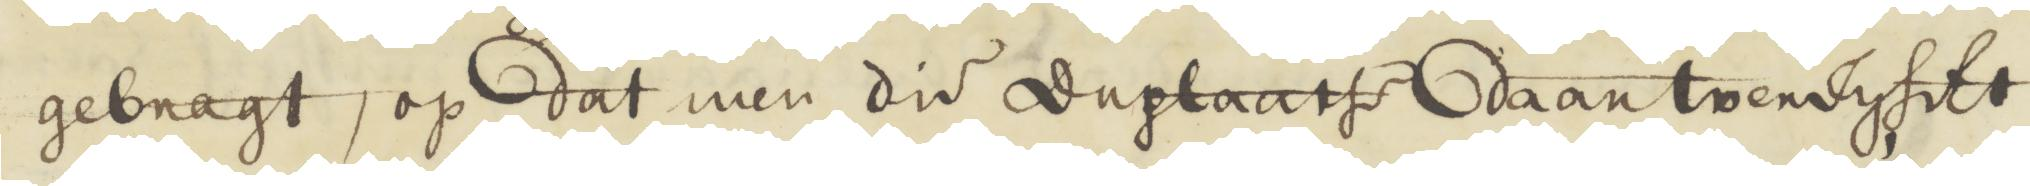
gebragt, op dat men die ter plaatse daar't verEyscht
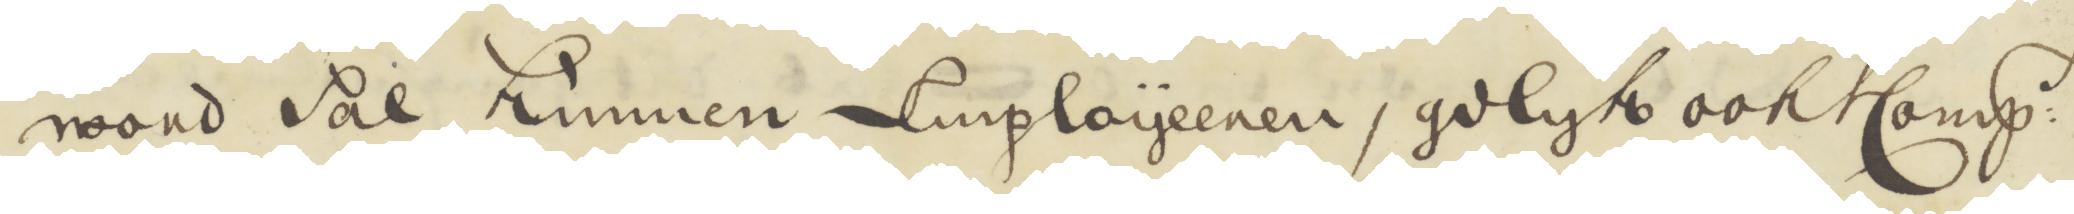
word sal kunnen Emploijeeren, gelyk ook 'sComp:s
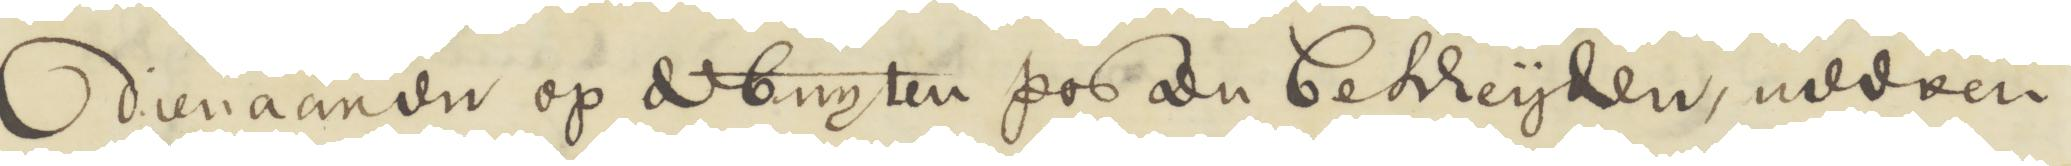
dienaaren op de buyten posten bescheijden, neeven
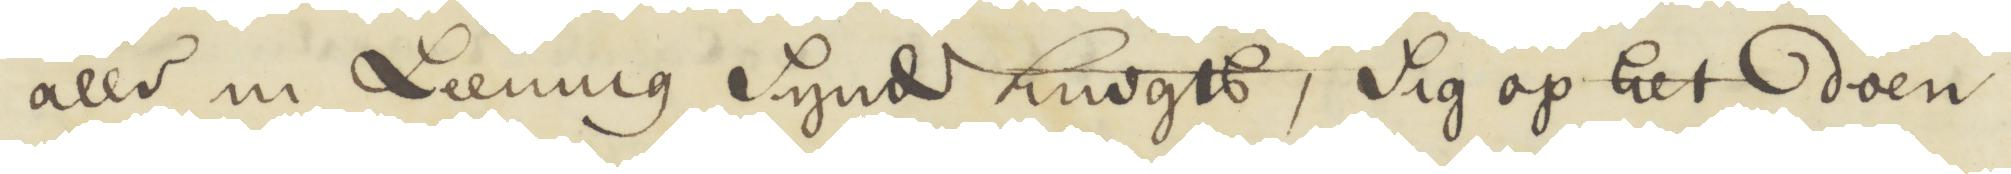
alle in Leening synde knegts, sig op het doen
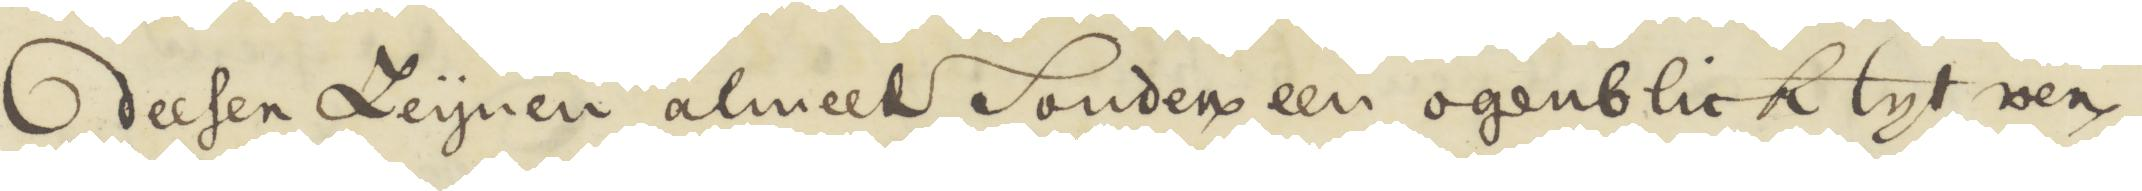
deeser zeijnen almeede sonder een ogenblick tyt ver,
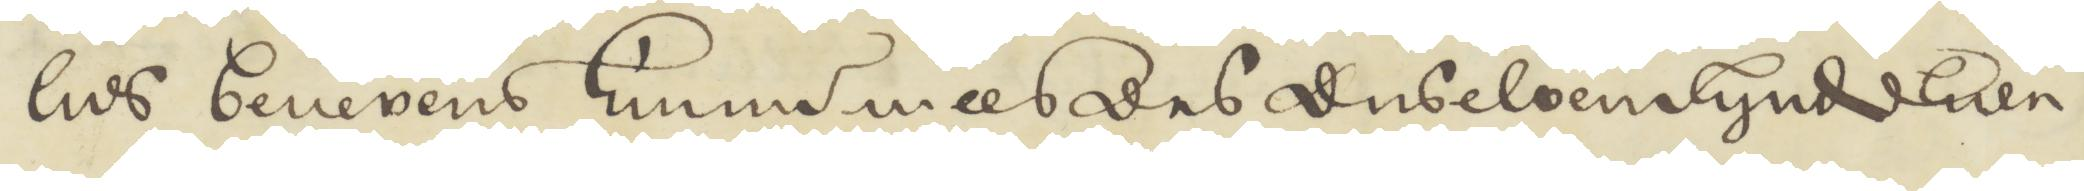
lies benevens hunne meesters tenselven Eynde hier
